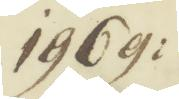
1969:
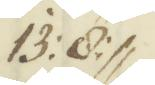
13: 8:„
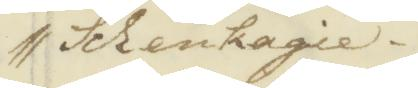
„ schenkagie -
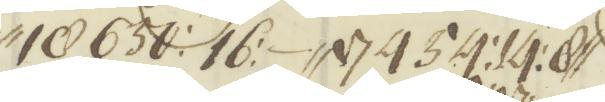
18650: 16:—„17454:14:8„
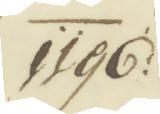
1196
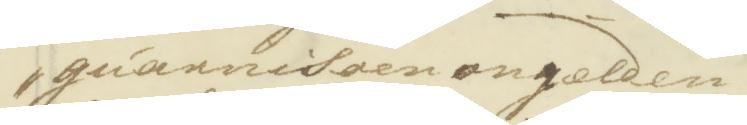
„guarnisoen ongelden
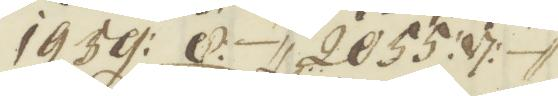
1959: 8:—„ 2055:17:—„
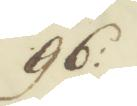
96: 9:
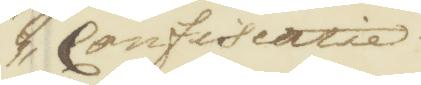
„ Confiscatie
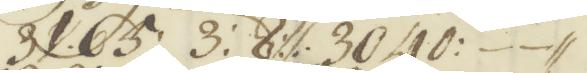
31.65: 3: 8:„.. 3040: — —„
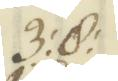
3:8:
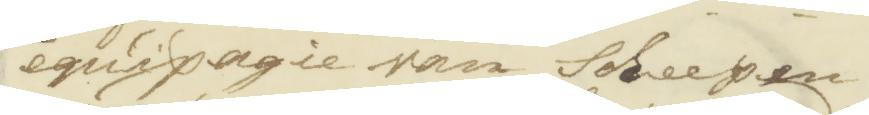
equipagie van scheepen
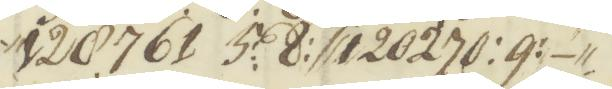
128761 5: 8:„120270:9:—„
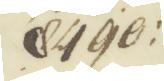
8490
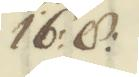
16: 8:
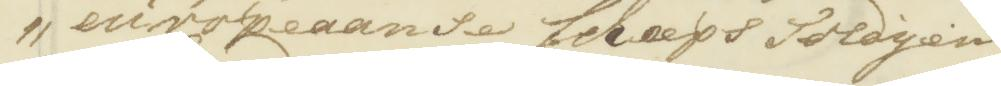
„europeaanse scheeps soldijen
